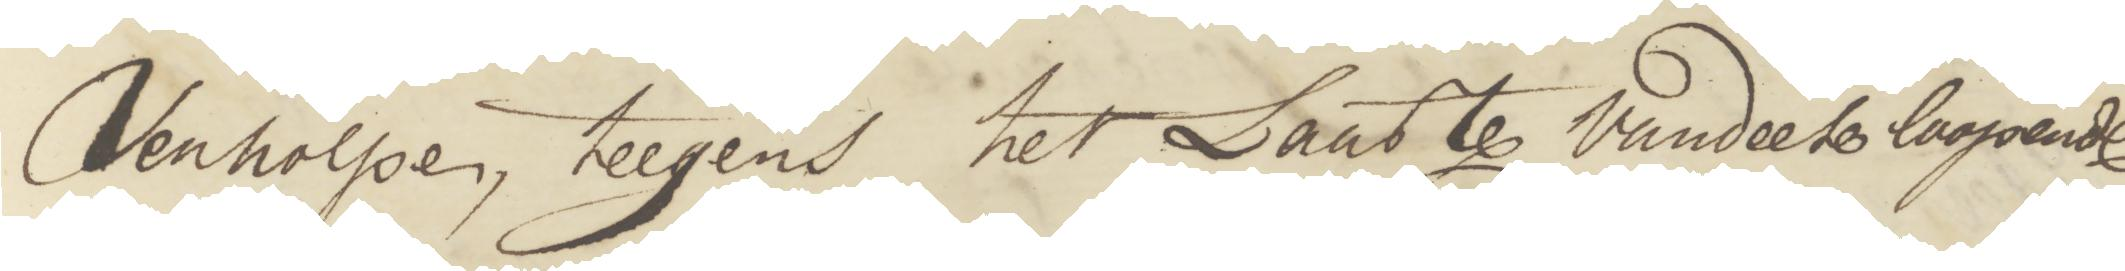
verholpe, teegens het Laatste van deese loopende
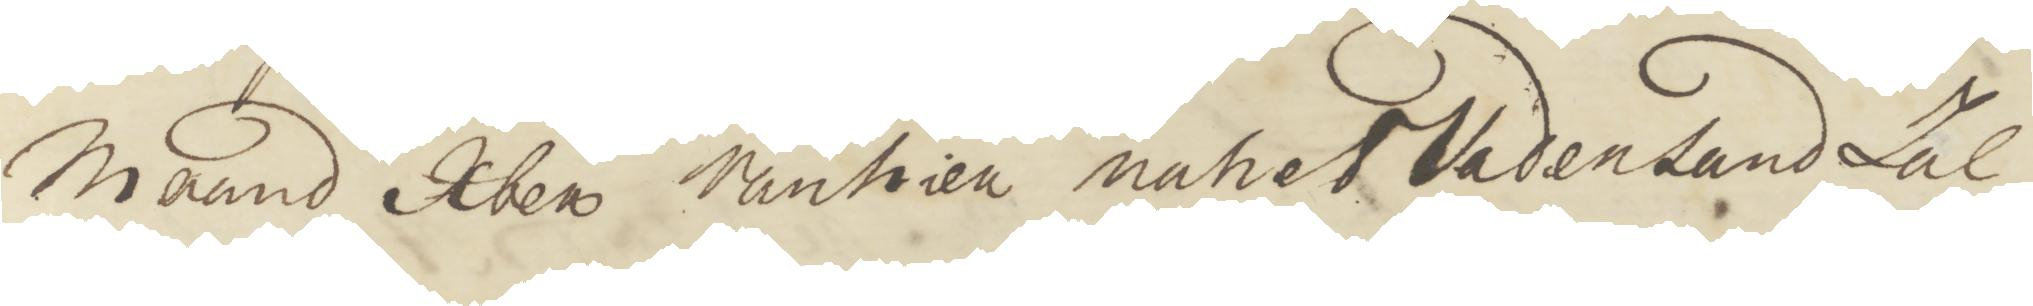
maand xber van hier na het Vaderland zal
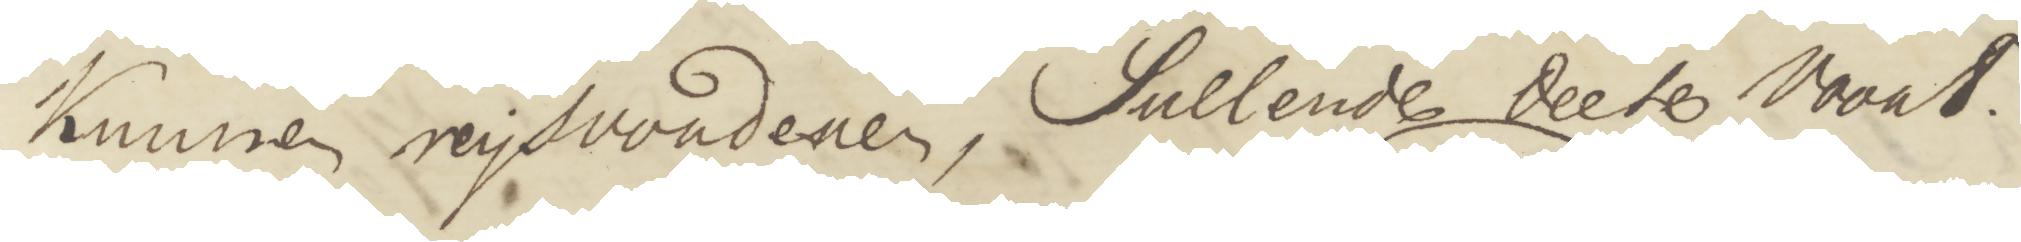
kunnen reijsvorderen, sullende deese voort.
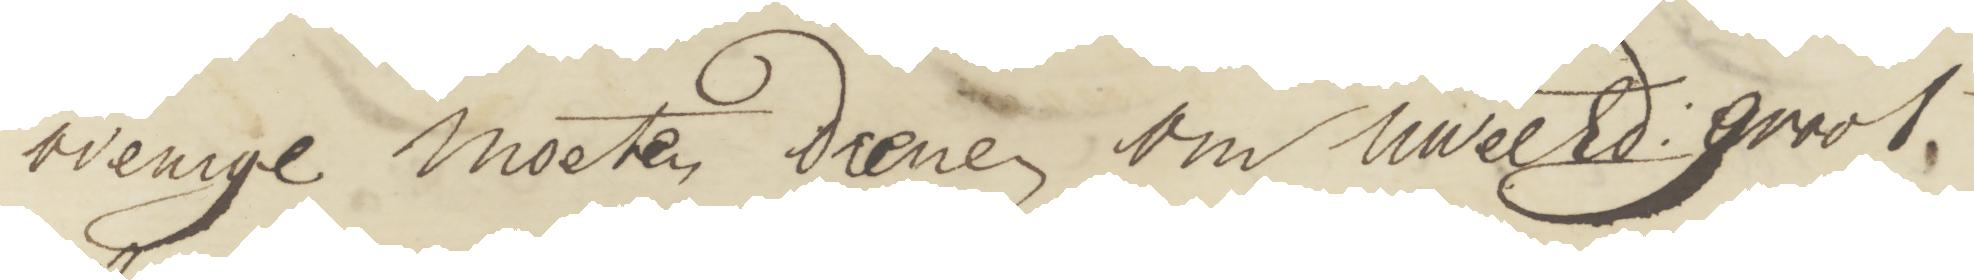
overige moeten dienen om uwe Ed: groot
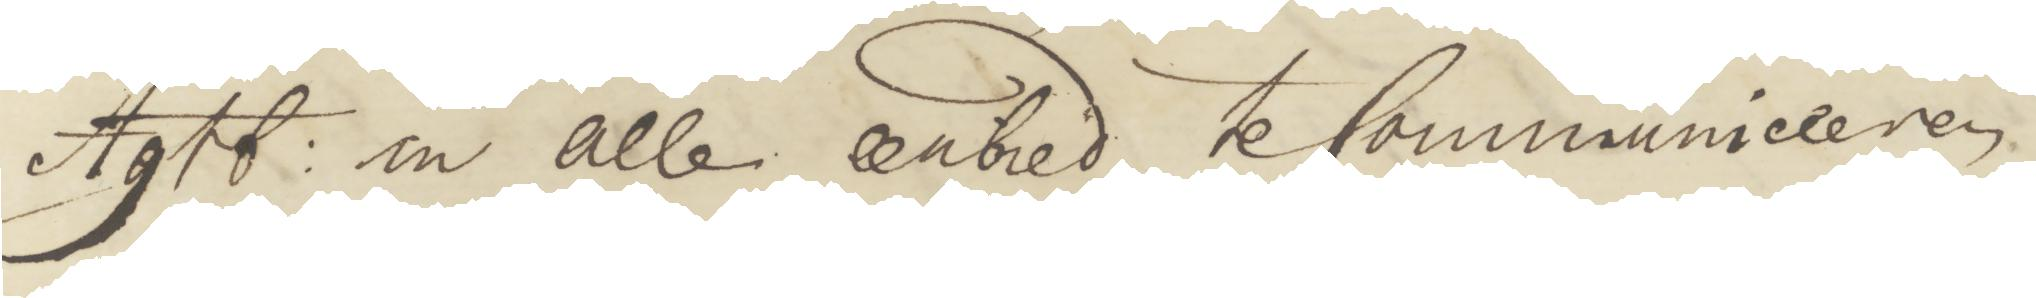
Agtb: in alle eerbied te Communiceeren
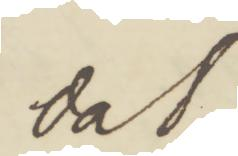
dat,
